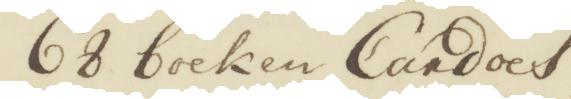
68 boeken Cardoes
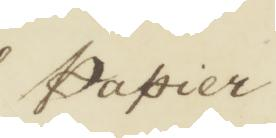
Papier
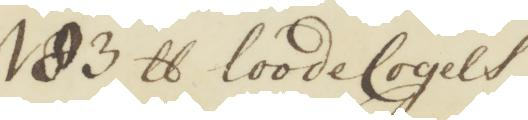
183 lb loode Cogels
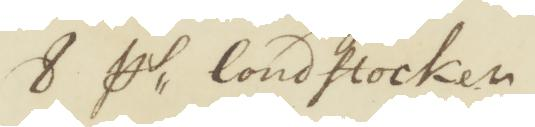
8 p„s londstocken
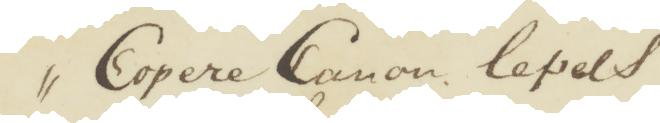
„ Copere Canon lepels
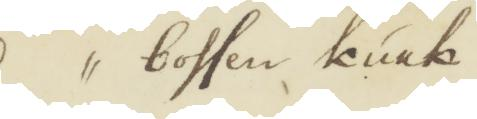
6 „ bossen kurk
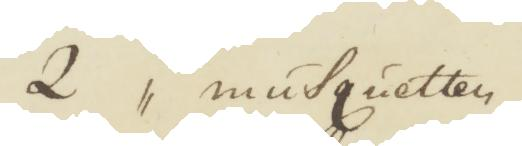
2 „ musquetten
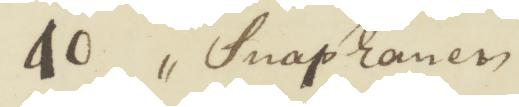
40 „ snaphanen
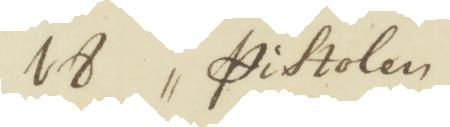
18 „ Pistolen
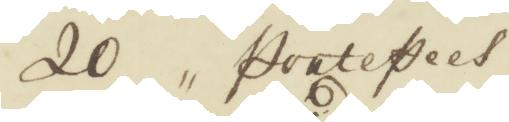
20 „ Portepees
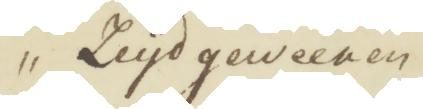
„ zeijd geweeren.
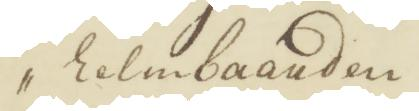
„ helmbaarden
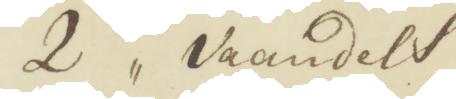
2 „ vaandels
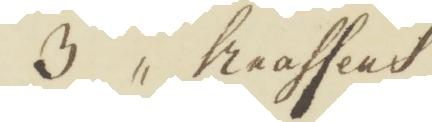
3 „ krassers
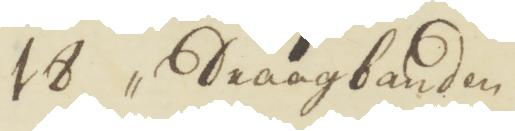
18 „ draagbanden
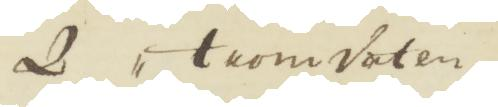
2 „ tromvaten
